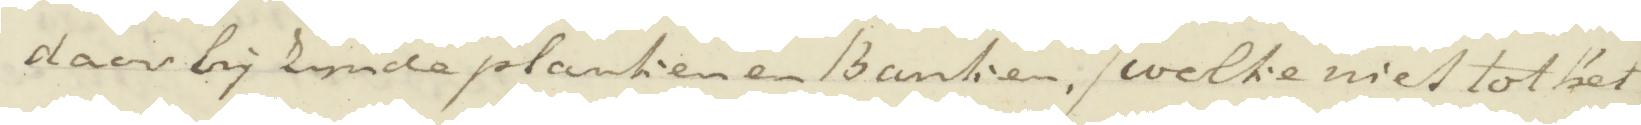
daar bij zynde planken en Banken. / welke niet tot het
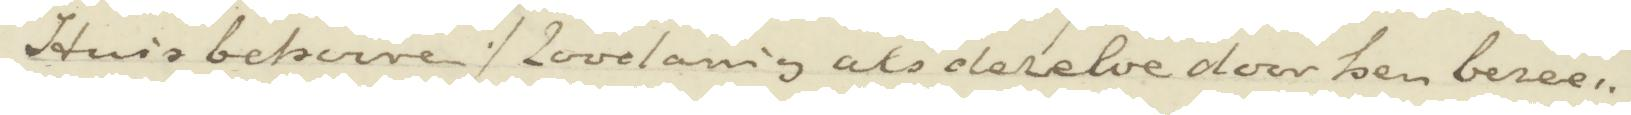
Huis behooren / Zoodanig als dezelve door hen bezee„
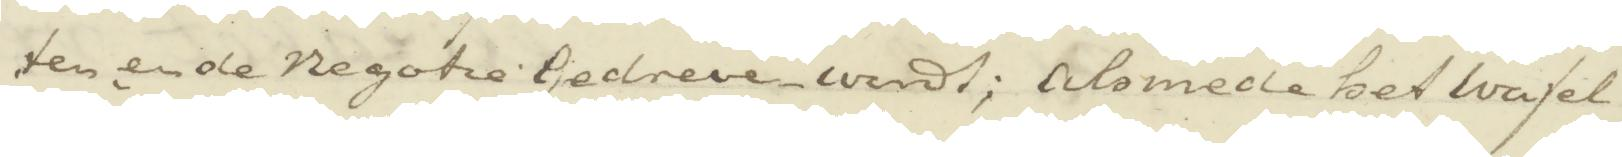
,ten en de Negotie Gedreven wordt; Alsmede het wafel
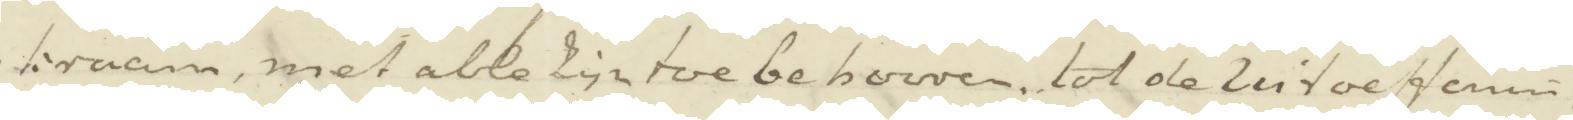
kraam, met alle zijn toebehooren, tot de uitoeffenin
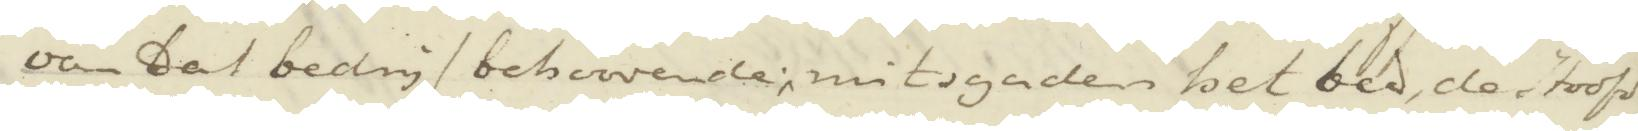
ven Dat bedrijf behoorende; mitsgaders het bed, de Hoofd
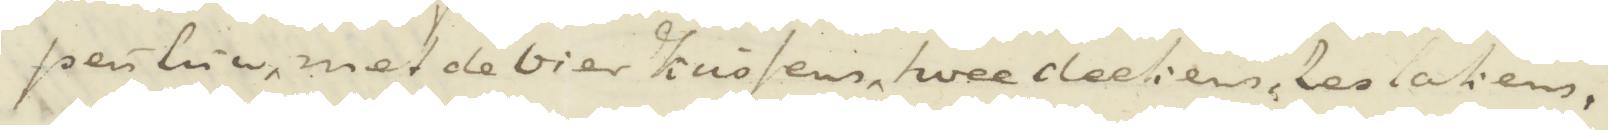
peuluen, met de vier kussens, twee deekens, zes lakens,
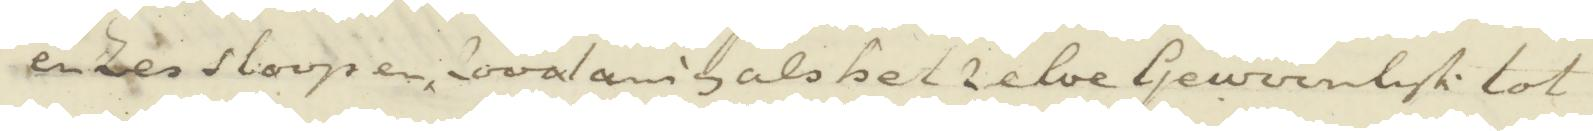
en zes sloopen, zoodanig als het zelve Gewoonlyk tot
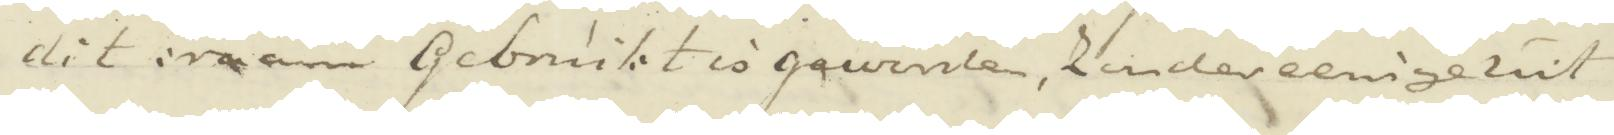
dit kraam Gebruikt is geworden, zonder eenige uit
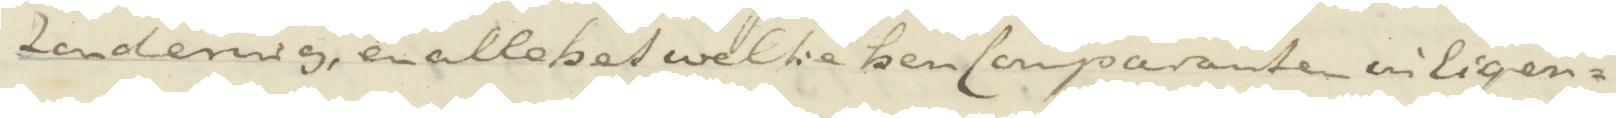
zondering, en alles het welke hen Comparanten in Eigen=
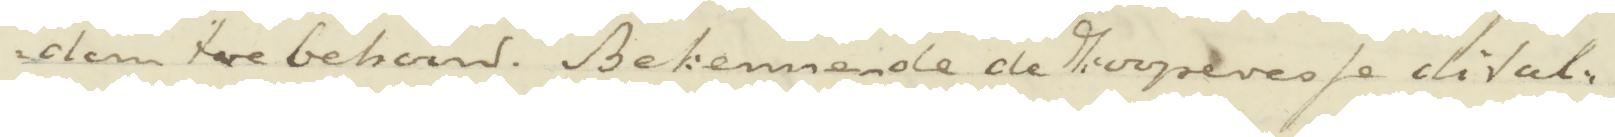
=dom toebehoord. Bekennende de Kooperesse dit al„
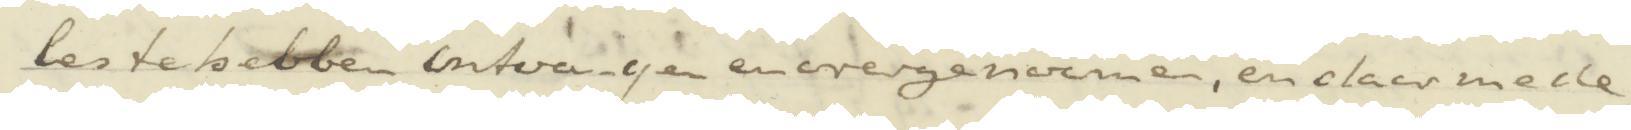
les te hebben ontvangen en overgenoomen, en daar mede
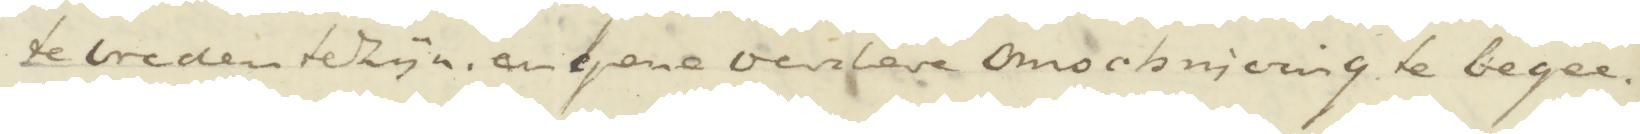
tevreden te zijn, en gene verdere omschrijving te begee,
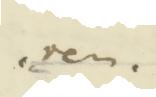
„ren.
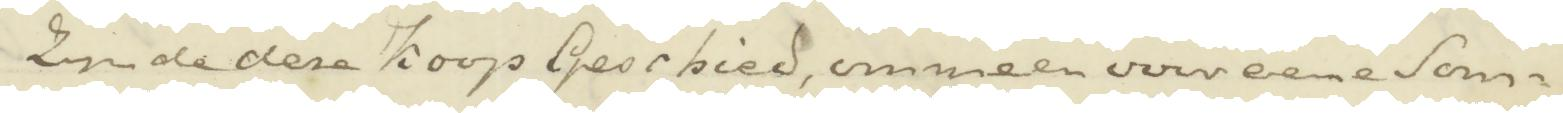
Ende deze koop Geschied, om meer voor eene som=
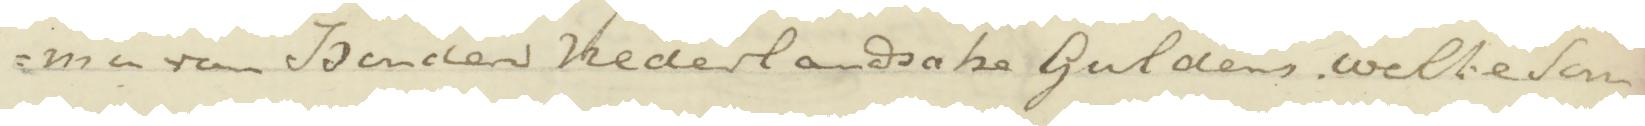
=ma van Honderd Nederlandsche Guldens, welke son
